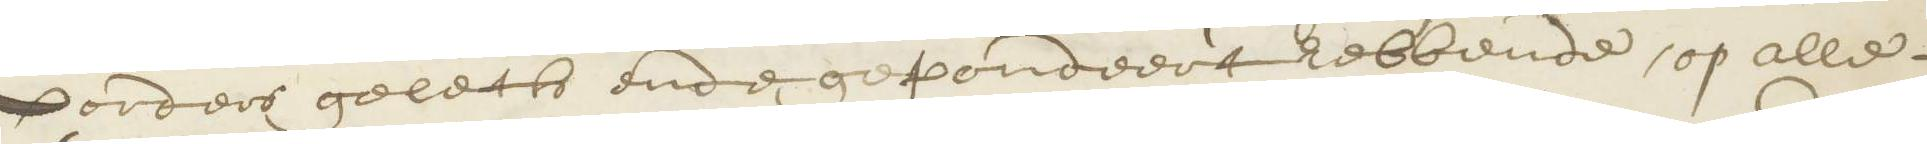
vorders geleth ende gepondeert hebbende, op alle
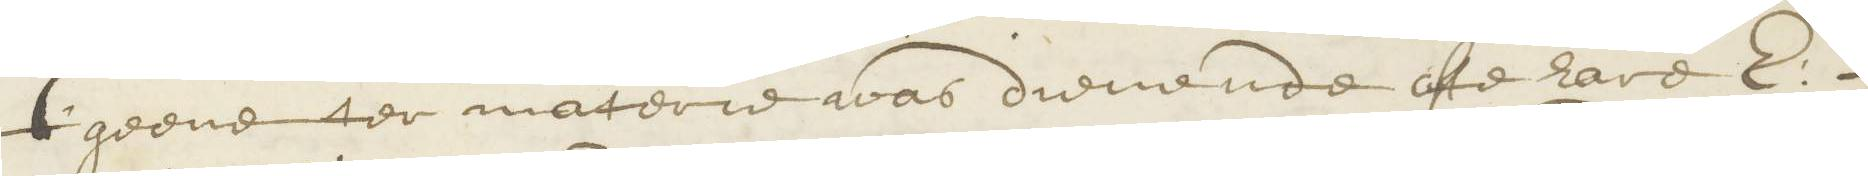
t geene ter materie was dienende ofte hare E: —
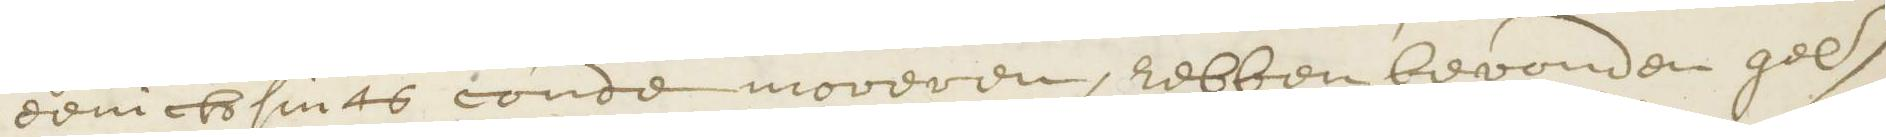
denichsints conde moveren, hebben bevonden gelijk
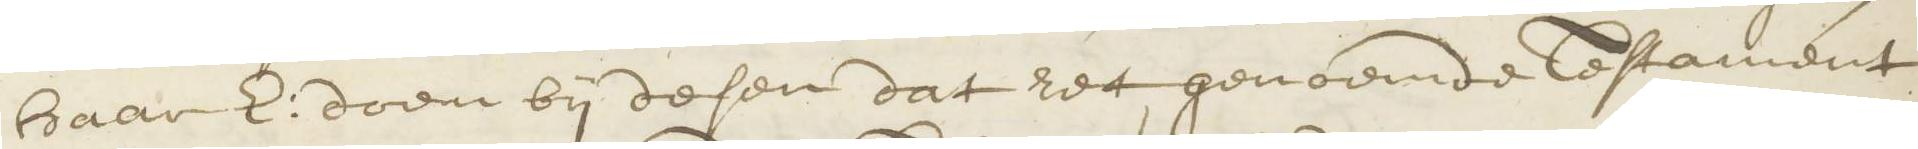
haar E: doen bij desen dat het genoemde testament
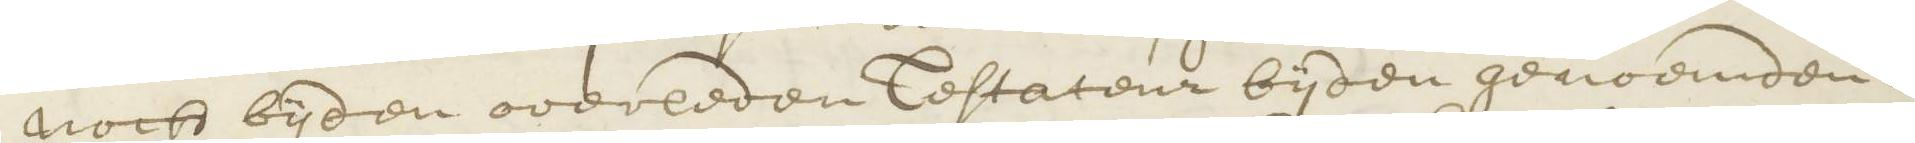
noch bij den overleden Testateur bijden genoemden
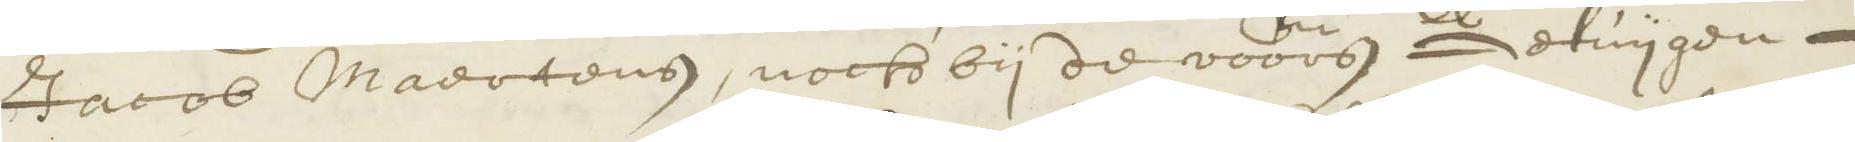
Jacob Maertens, noch bij de voors Getuijgen —
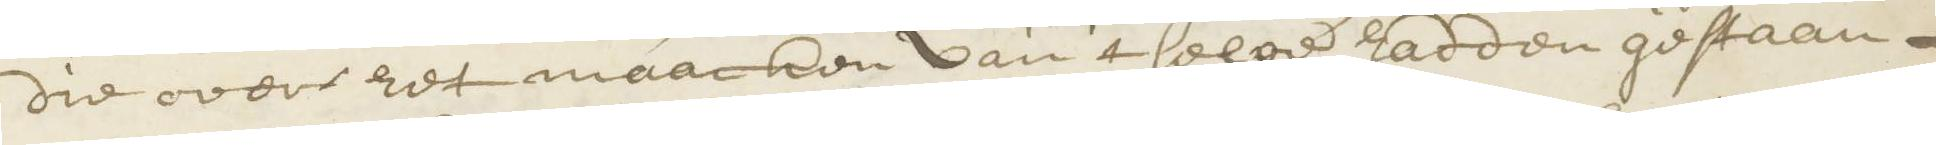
die over het maacken van ’t selve hadden gestaan -
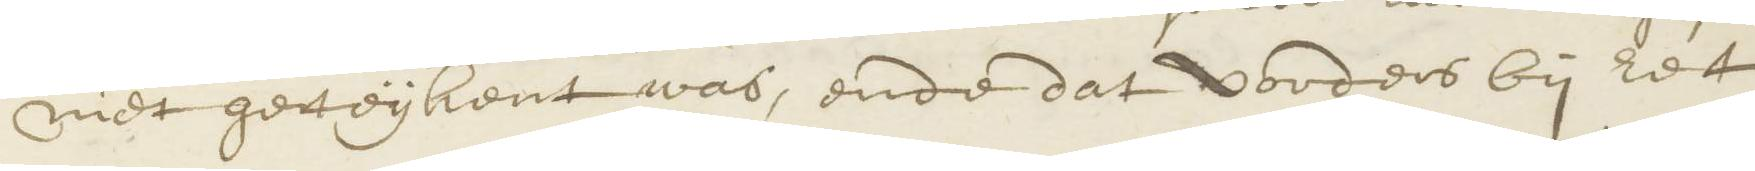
niet geteijkent was, ende dat vorders bij het
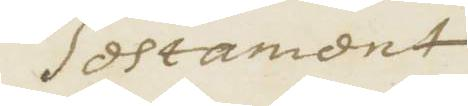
Testament
